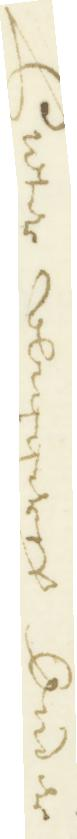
Pieter wygers Onder
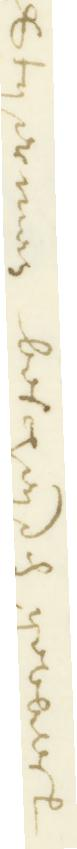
Styerman bescheyden geweest
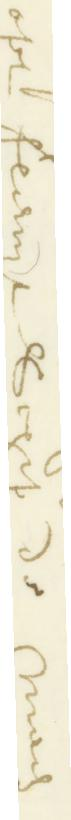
opt schuij Schip de Maen
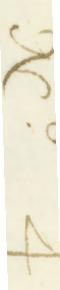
N.o 4
